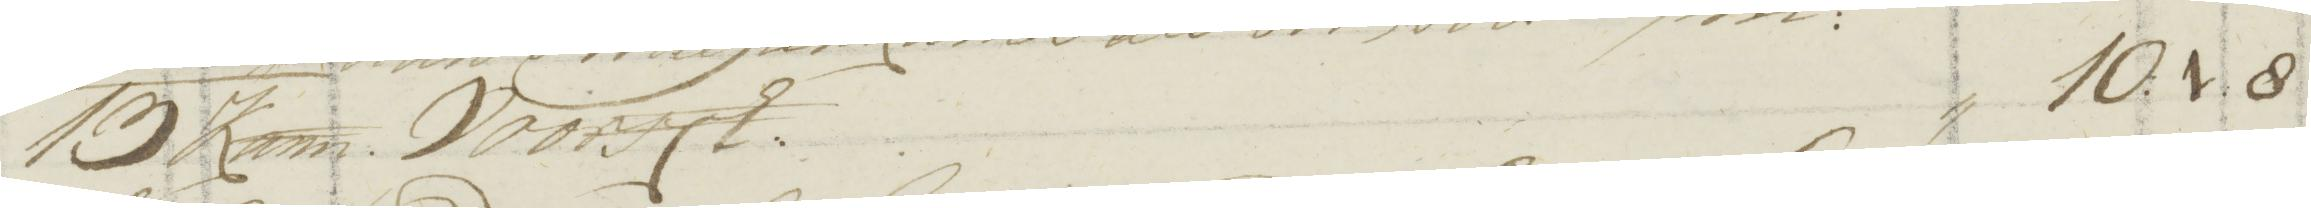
13 Kann. Voorsch: „ 10: 1. 8
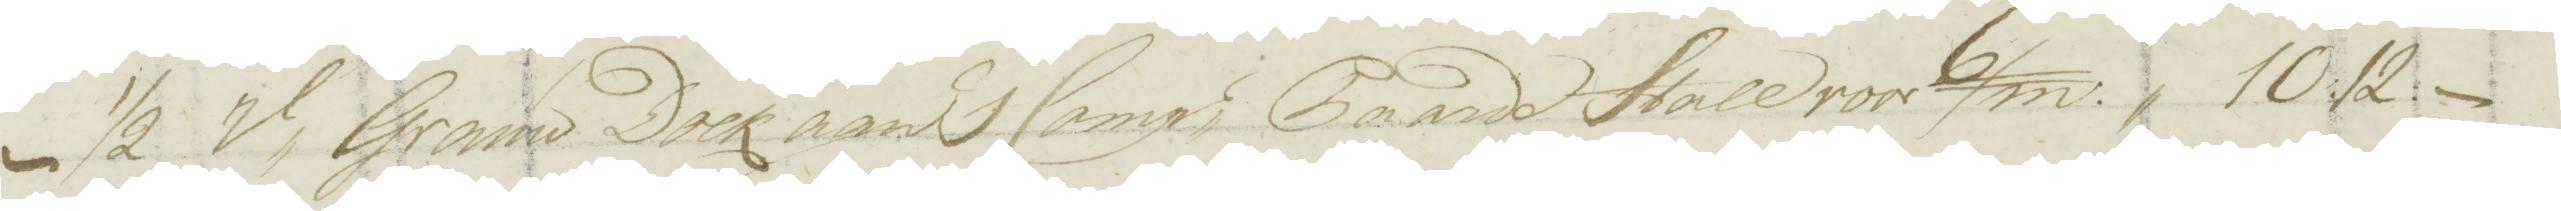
—½ r„l Grauw Doek aan ’s Comp„s Paarde stall voor 6/m „ 10: 12: —
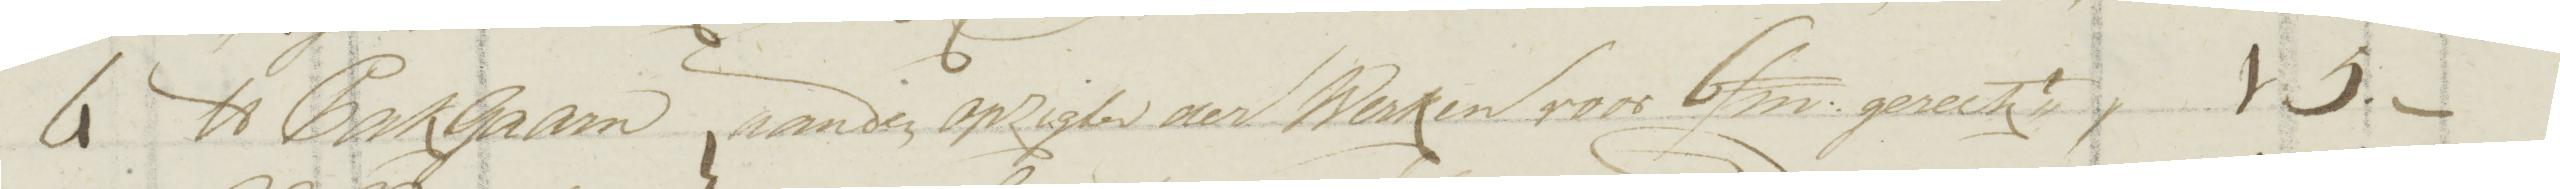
4 lb Pak gaarn aan den opzigter der werken voor 6/m: gereek„t 1 5. —
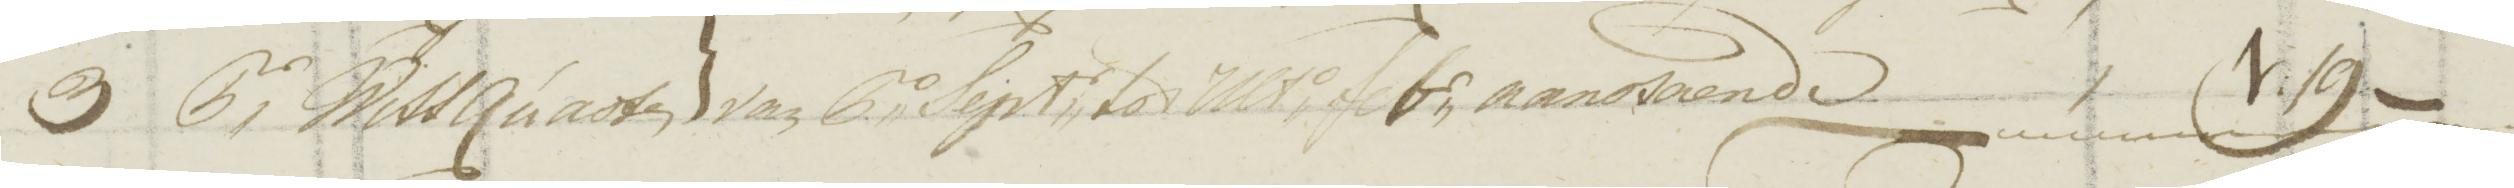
3 P„s Wissquasten van P„o sept„r tot ult„o feb„r aanstaende „ 1: 19 —
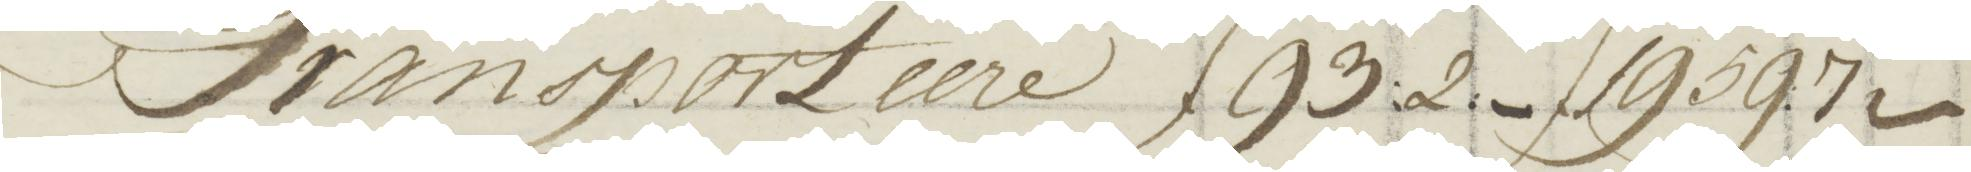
Transporteere ƒ93:2:— ƒ1959: 7 —
